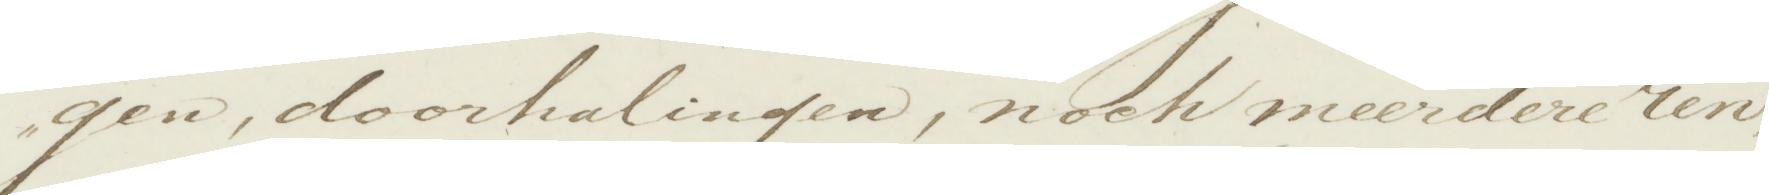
„gen, doorhalingen, noch meerdere ren
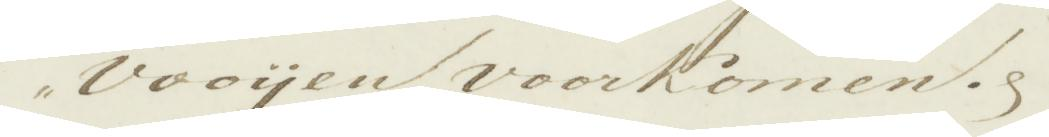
„vooijen voorkomen.
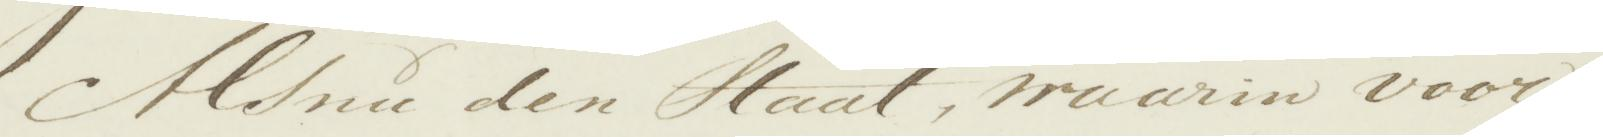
Alsnu den Staat, waarin voor
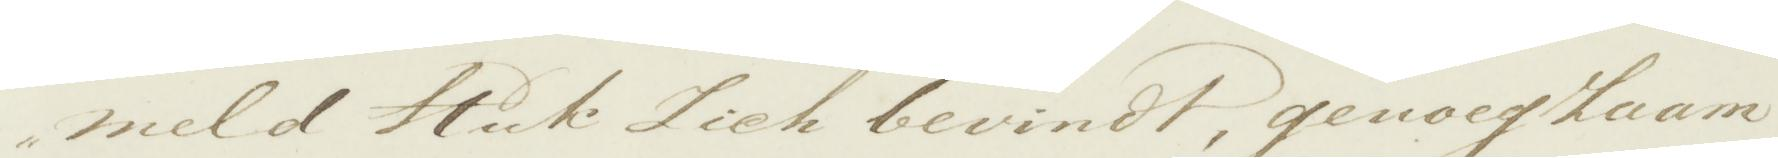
„meld stuk zich bevindt, genoegzaam
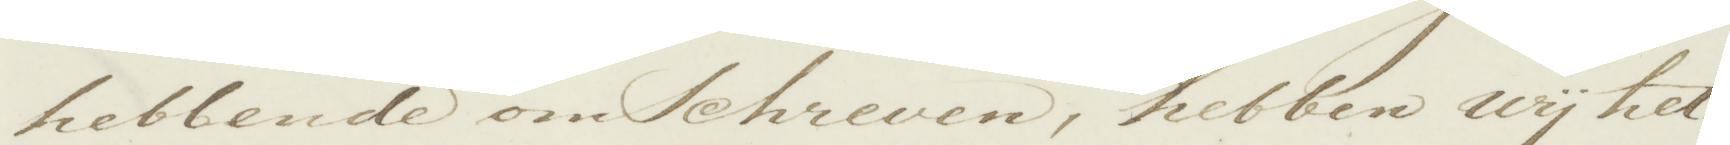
hebbende omschreven, hebben wij het
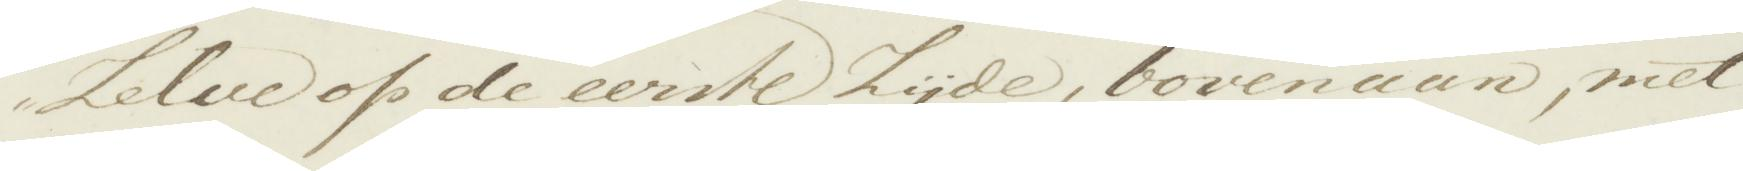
„zelve op de eerste zijde, bovenaan, met
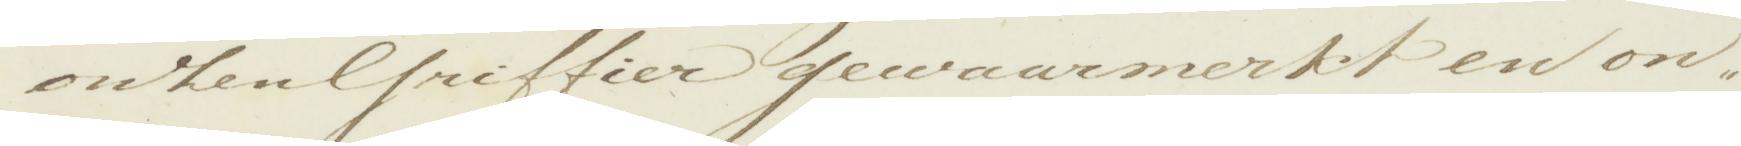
onzen Griffier gewaarmerkt en on„
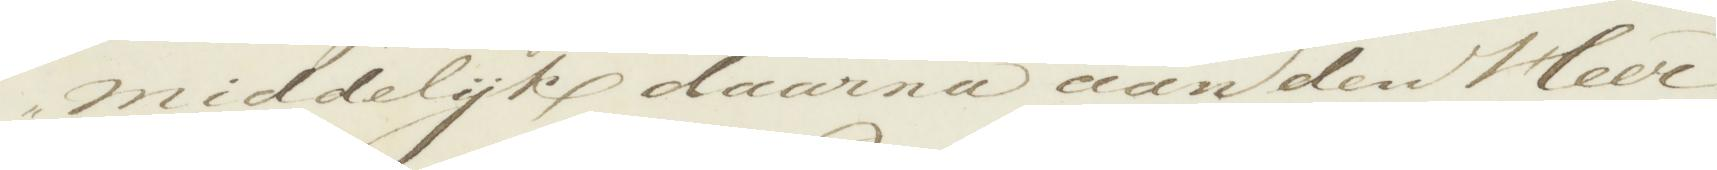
„middelijk daarna aan den Heer
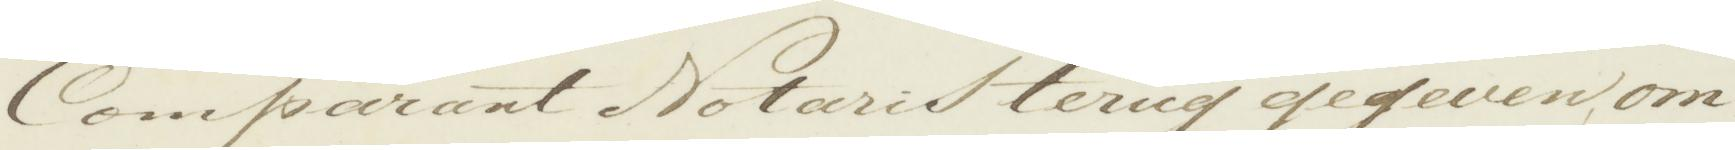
Comparant Notaris terug gegeven, om
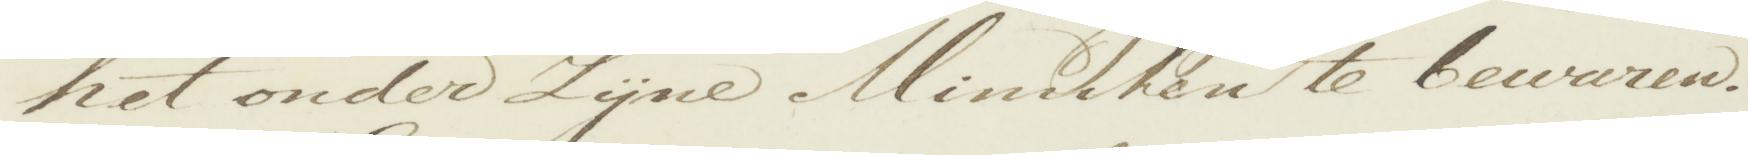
het onder zijne Minuten te bewaren.
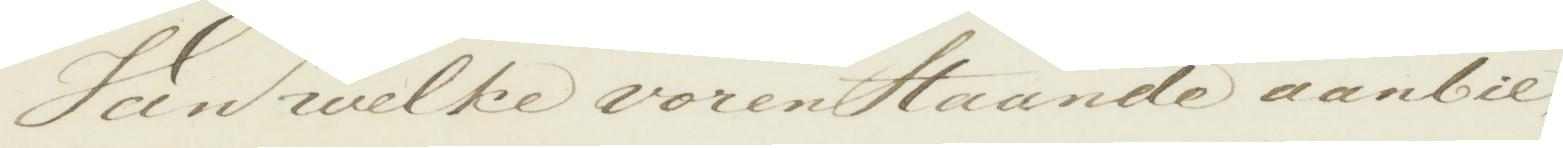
Van welke vorenstaande aanbie
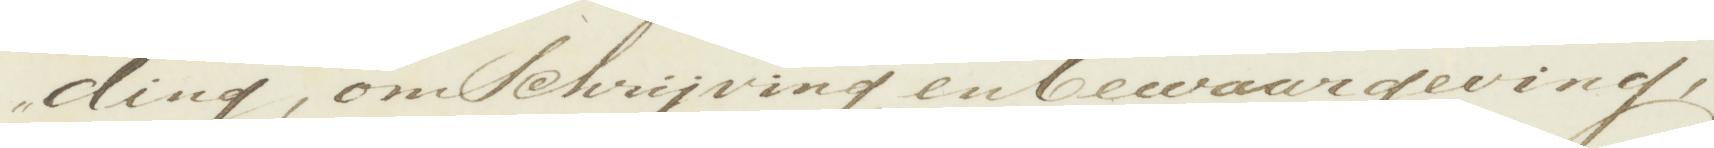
„ding, omschrijving enbewaargeving
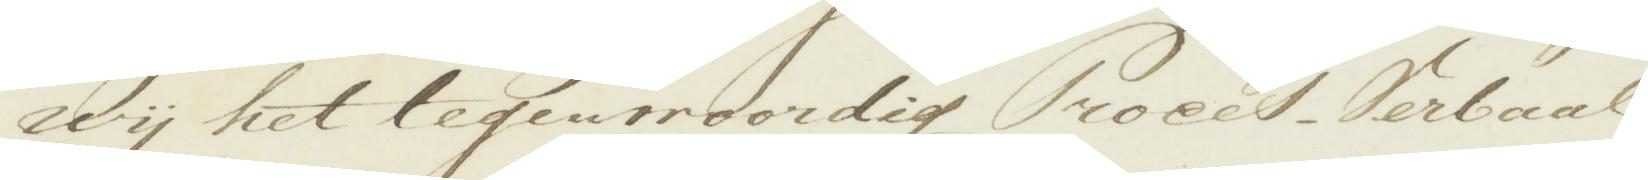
wij het tegenwoordig Proces-Verbaal
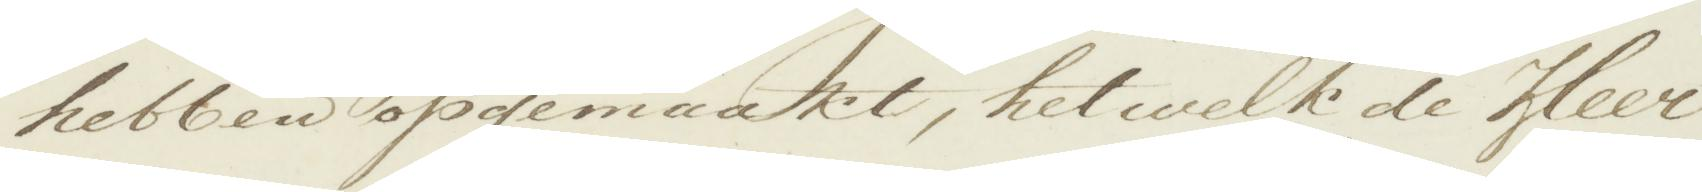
hebben opgemaakt, het welk de Heer
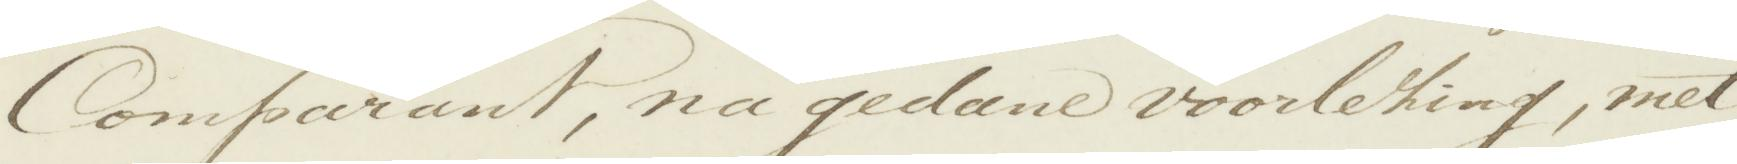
Comparant, na gedane voorlezing, met
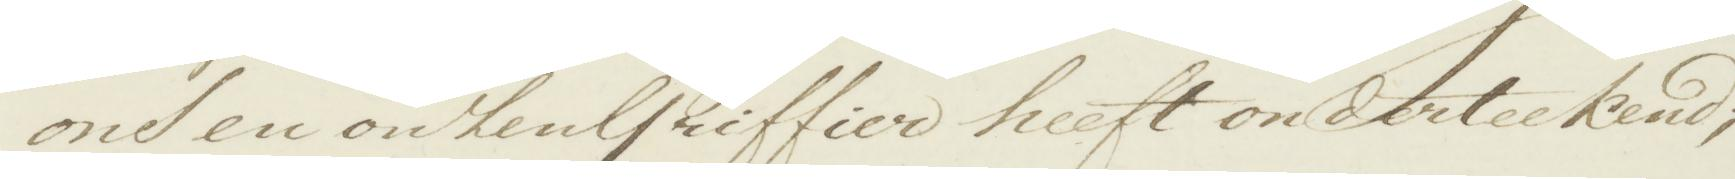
ons en onzenGriffier heeft onderteekend;
